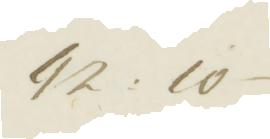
42: 10 —
